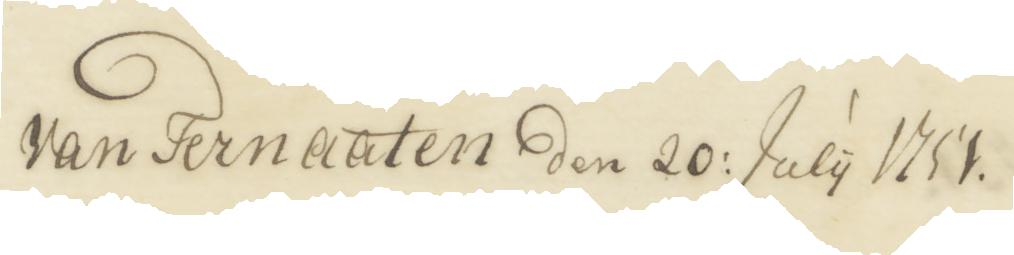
van Ternaaten den 20: Julij 1751.
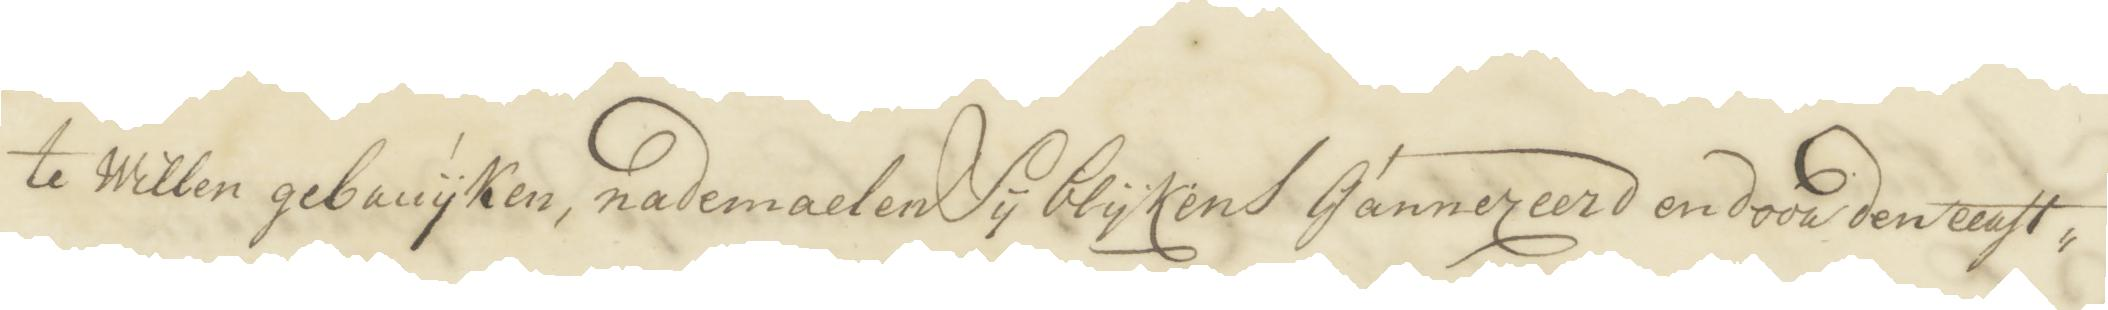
te willen gebruijken, nademaelen Sij blijkens g'annexeerd en door den eerst„
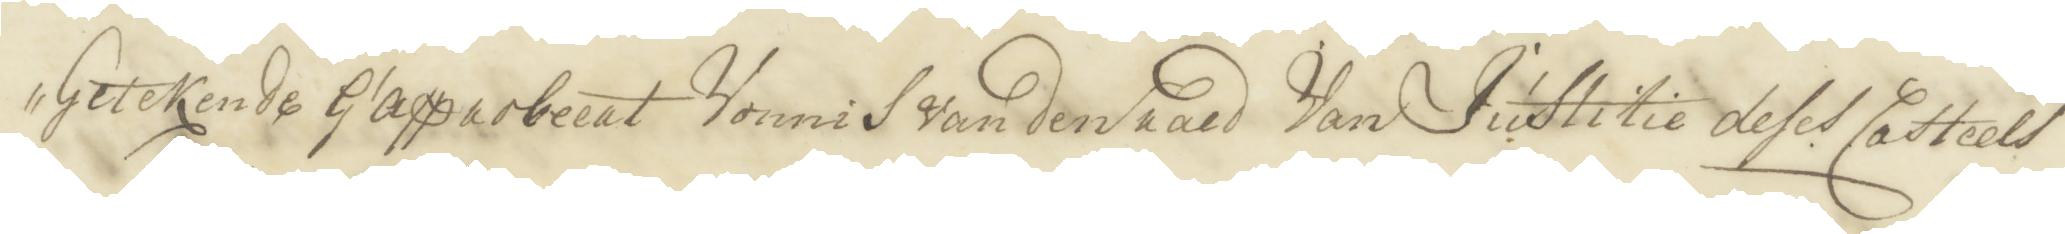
„Getekende G'approbeert Vonnis van den raed Van Iustitie deses Casteels
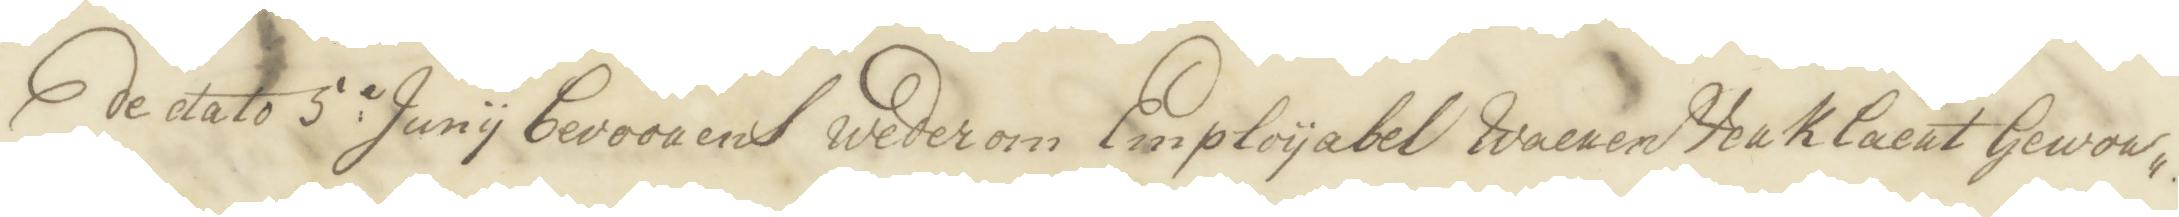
de dato 5,e Junij bevoorens wederom Emploijabel waeren Verklaert Gewor„
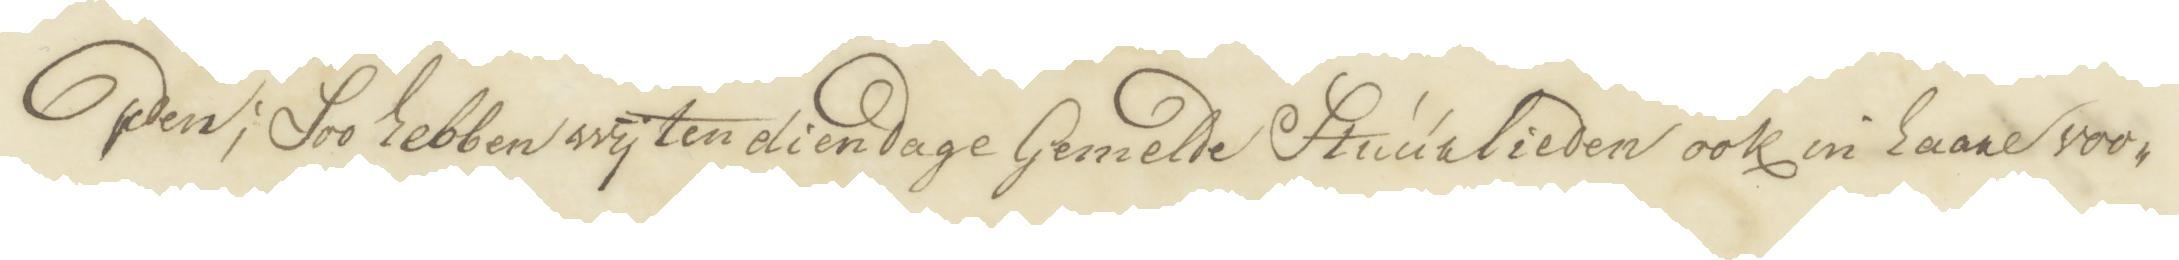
den; Soo hebben wij ten dien dage Gemelde Stuurlieden ook in haare voo
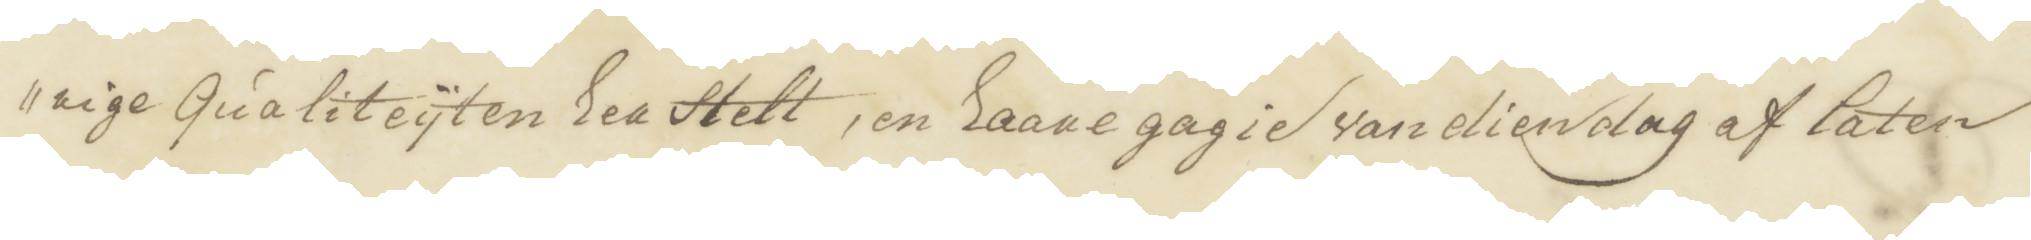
„rige qualiteijten herstelt, en haare gagie van dien dag af laten
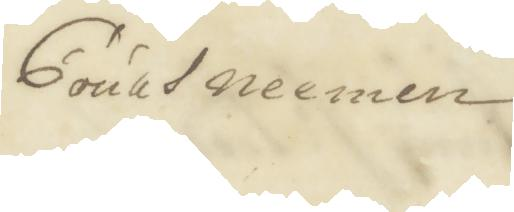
Cours neemen
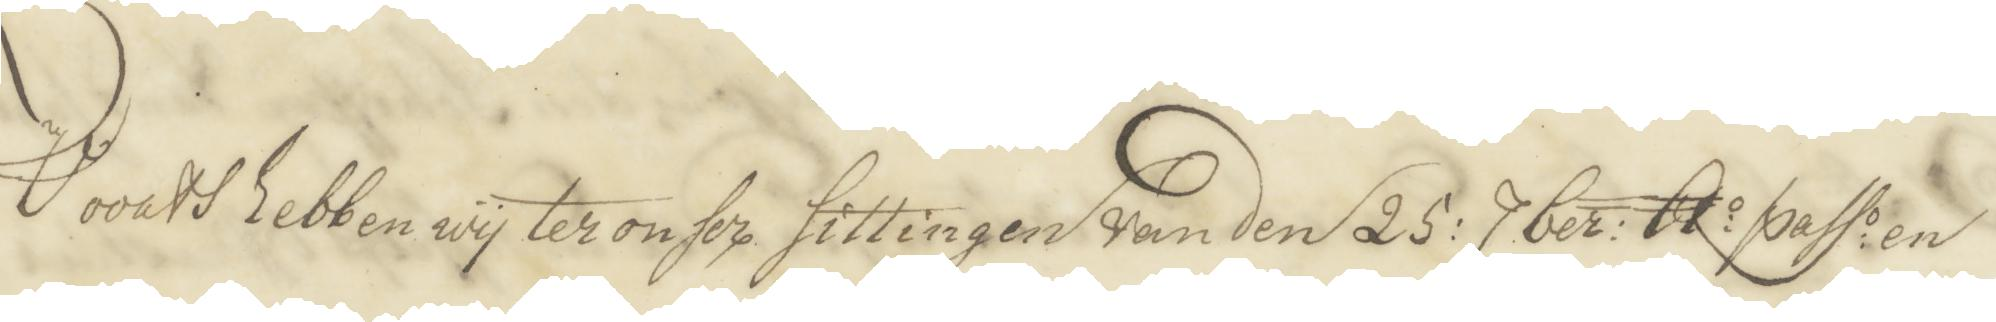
Voorts hebben wij ter onser sittingen van den 25: 7ber: A:o pass:o en
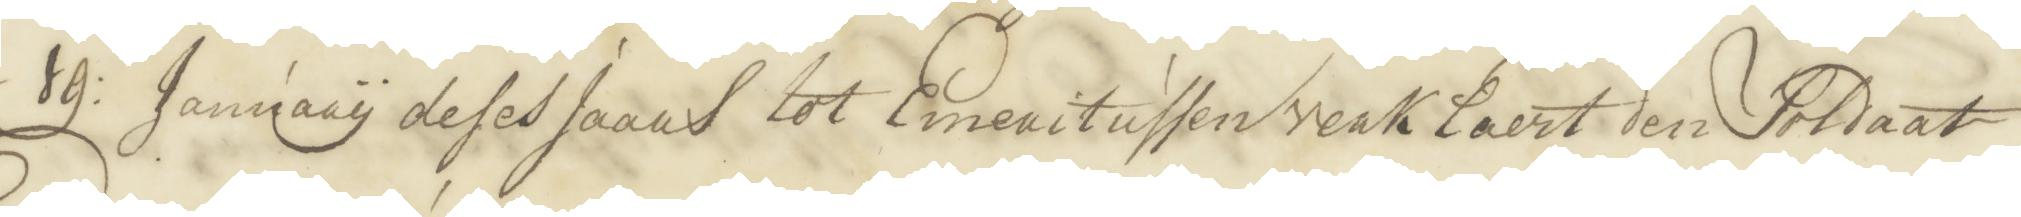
19: Januarij deses Jaars tot Emeritussen verklaert den Soldaat
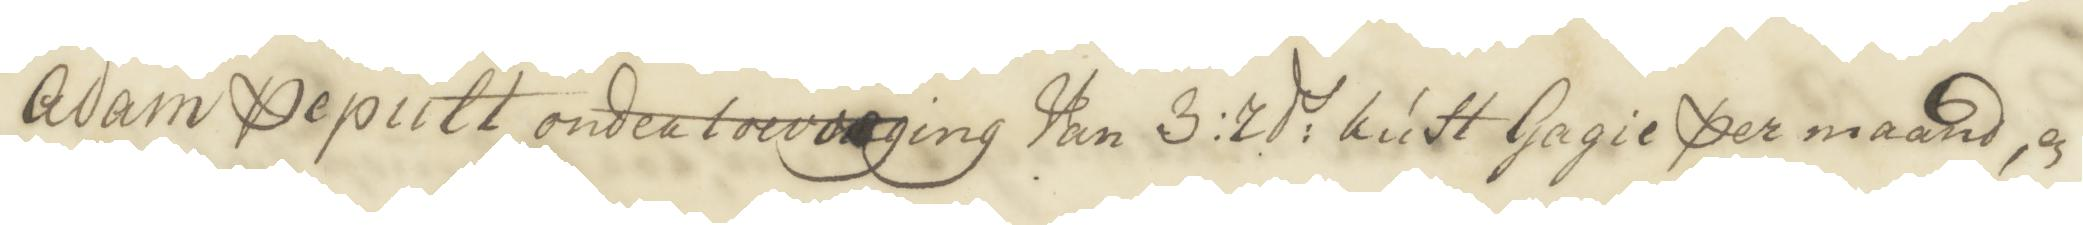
adam pepult onder toevooging Van 3: rd:s kust Gagie per maand, en
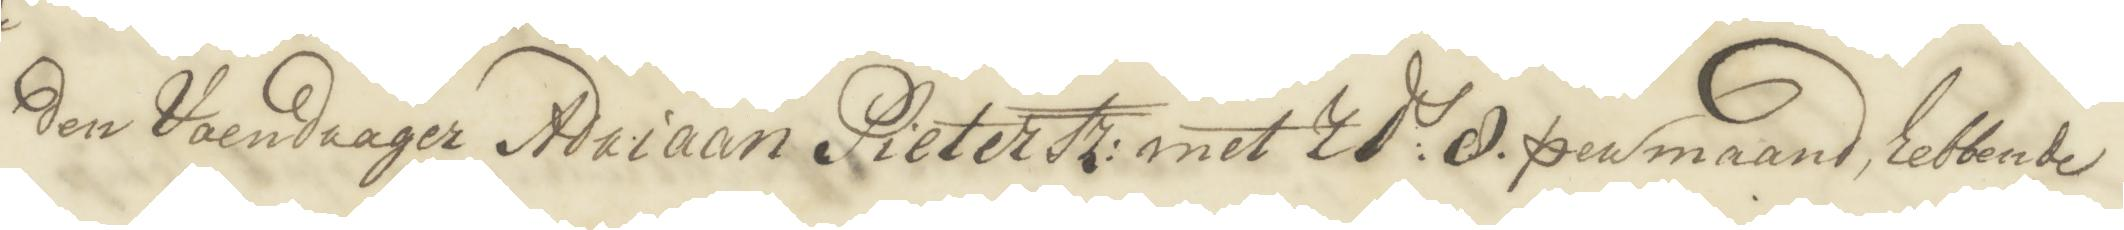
den Vaendrager Adriaan Pietersz: met rd:s 8. per maand, hebbende
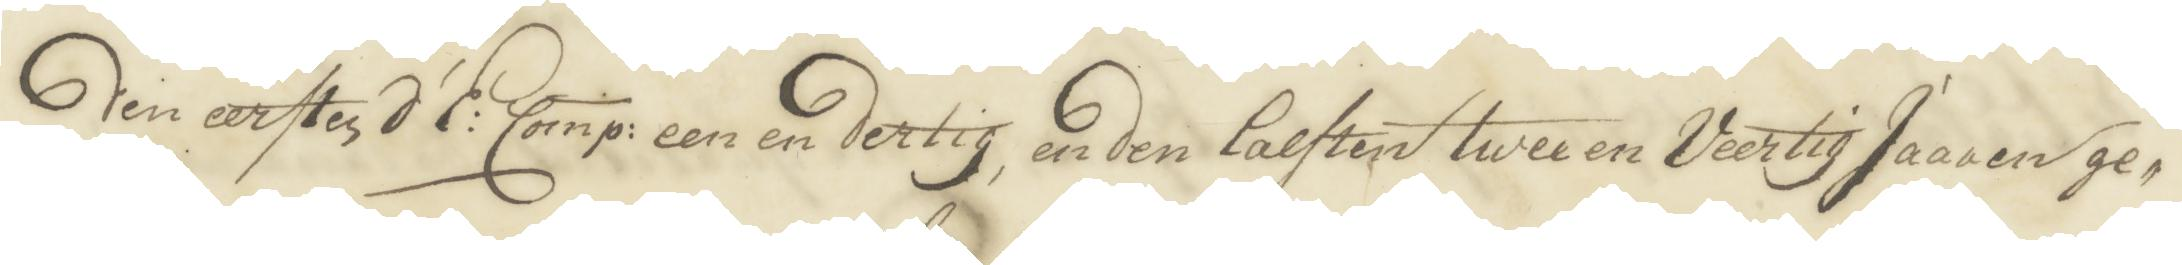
den eersten d’ E: Comp: een en dertig, en den laesten twee en veertig Jaaren ge„
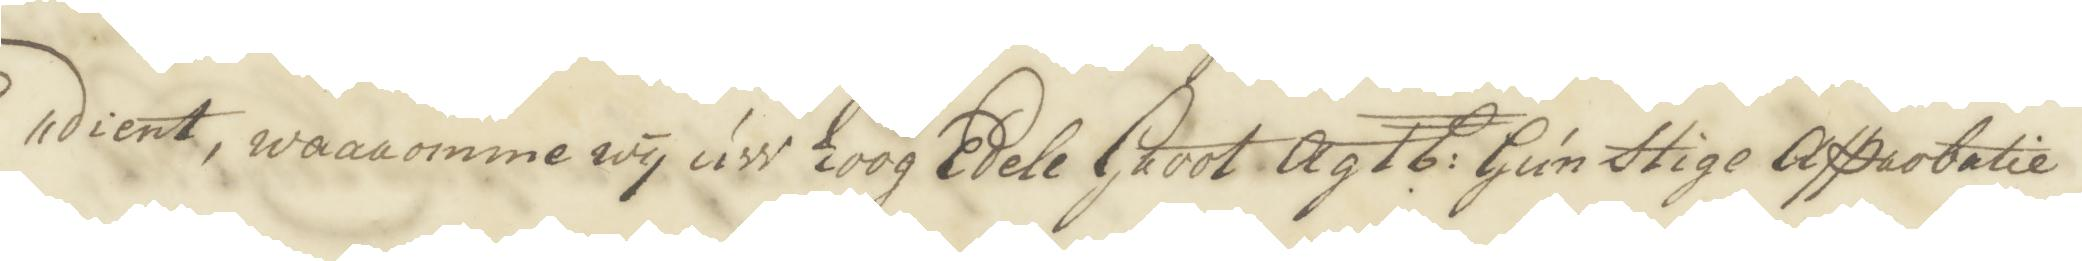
dient, waaromme wij uw hoog Edele Groot Agtb: Gunstige Approbatie
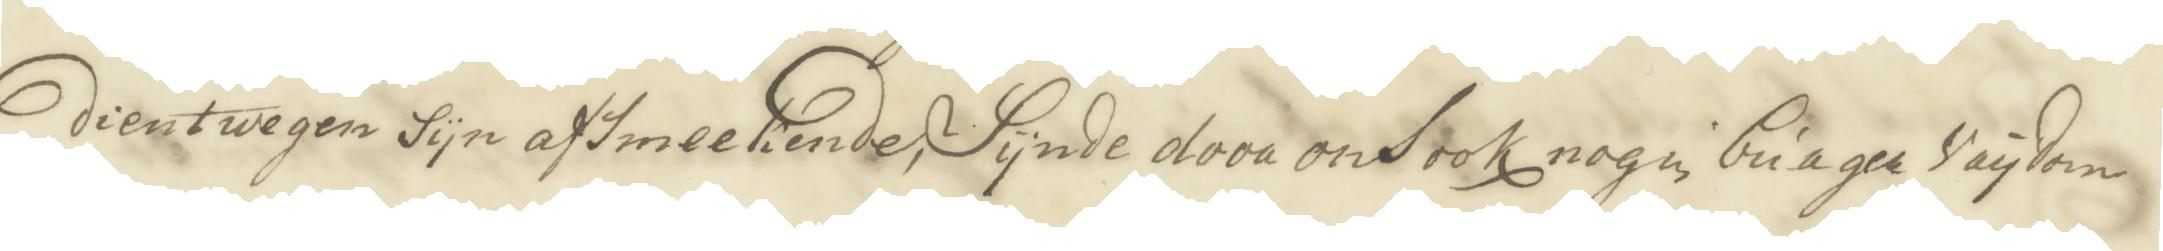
dientwegen sijn afsmeekende, Sijnde door ons ook nog in burger Vrijdom
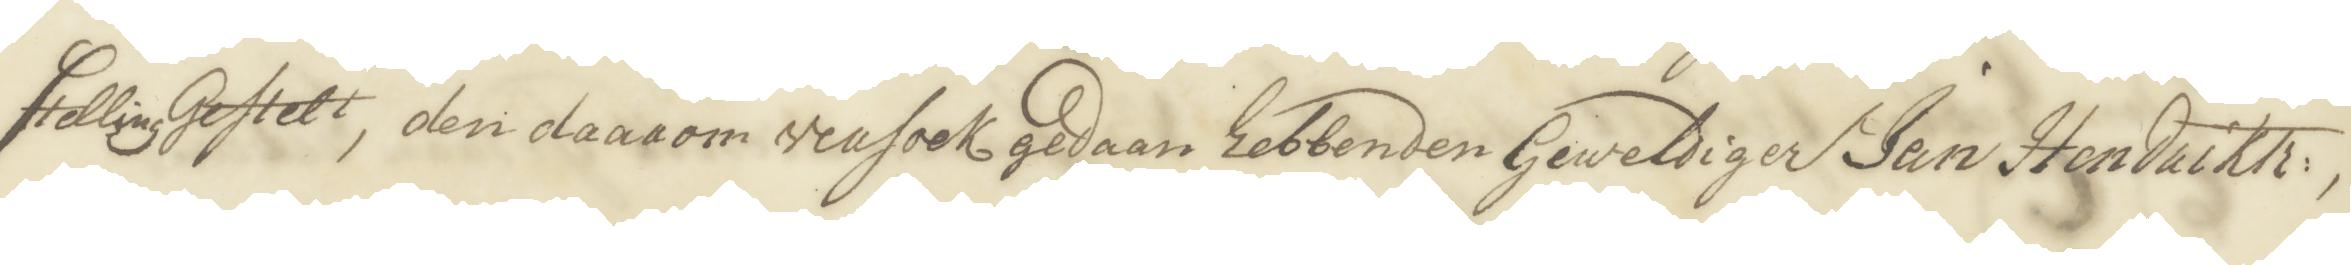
Stelling Gestelt, den daarom versoek gedaan hebbenden Geweldiger Ian Hendriksz:
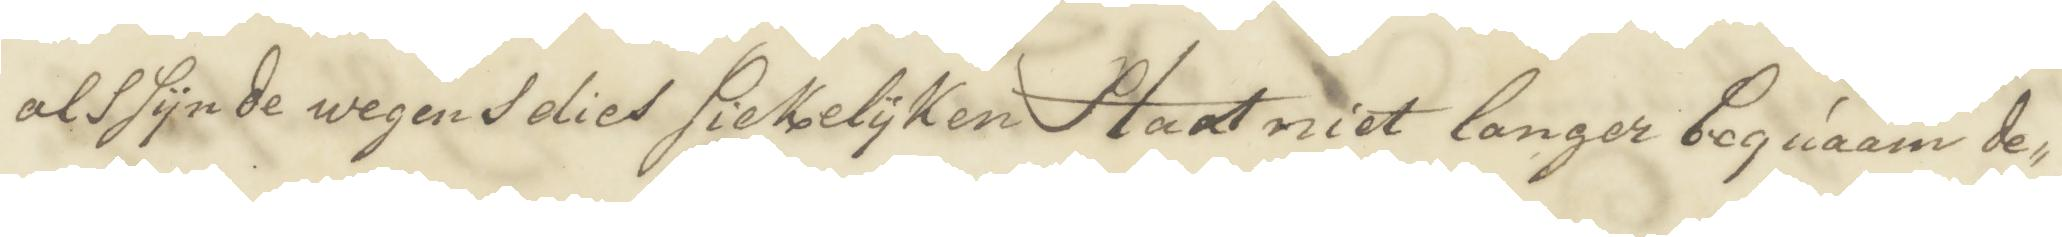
als sijnde wegens dies siekelijken staat niet langer bequaam de„
